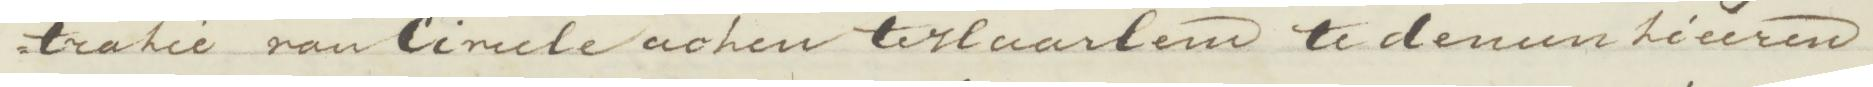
„tratie van Civiele acten te Haarlem te denuntieeren
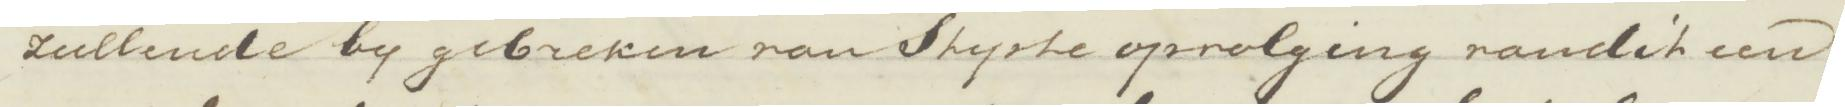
zullende by gebreken van stipte opvolging van dit een
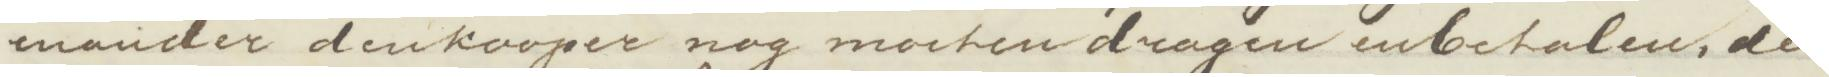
en ander den kooper nog moeten dragen en betalen, de
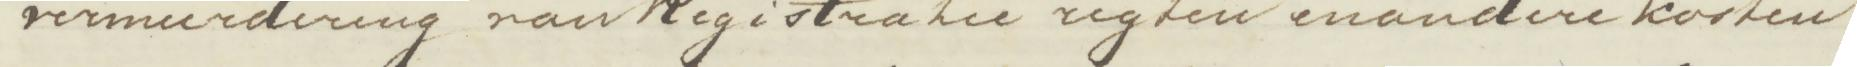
vermeerdering van Registratie regten en andere kosten
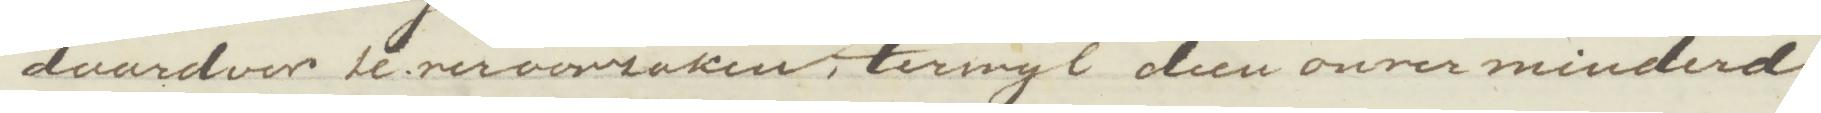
daardoor te veroorzaken, terwyl dien onverminderd
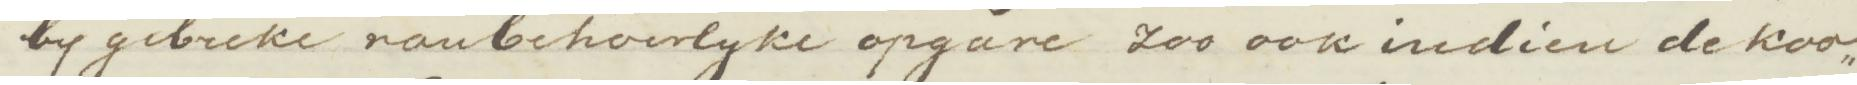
by gebreke van behoorlyke opgave zoo ook indien de koo„
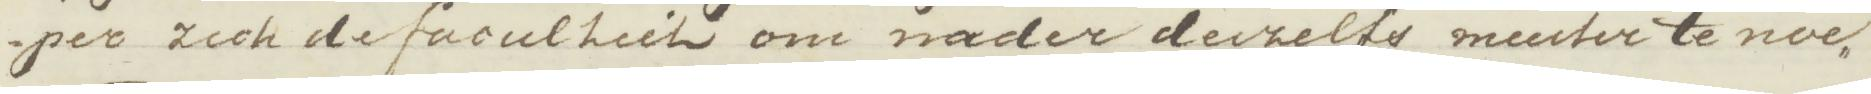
„per zich de faculteit om nader deezelfs meester te noe„
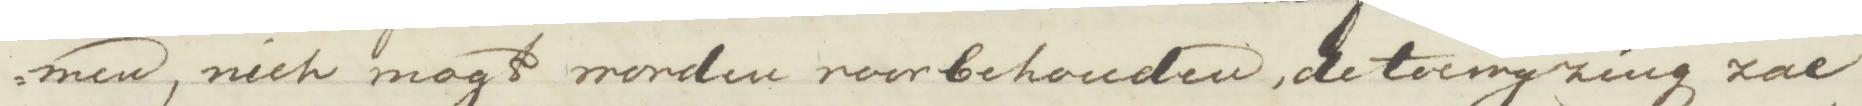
„men, niet mogt worden voorbehouden, de toewyzing zal
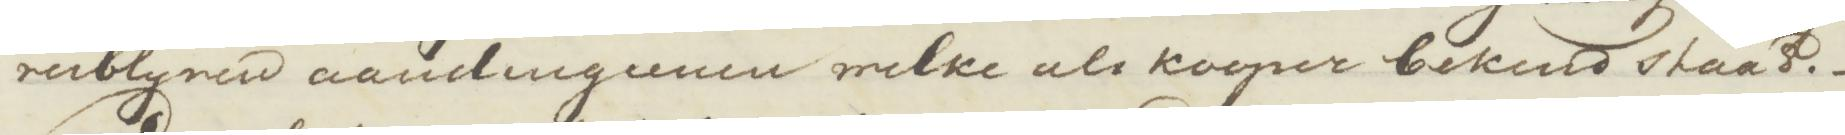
verblyven aan den geenen welke als kooper bekend staat.-
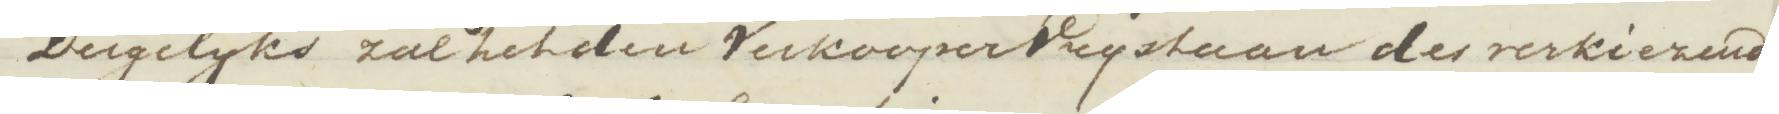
Dergelyks zal het den Verkooper Vrystaan des verkiezend,
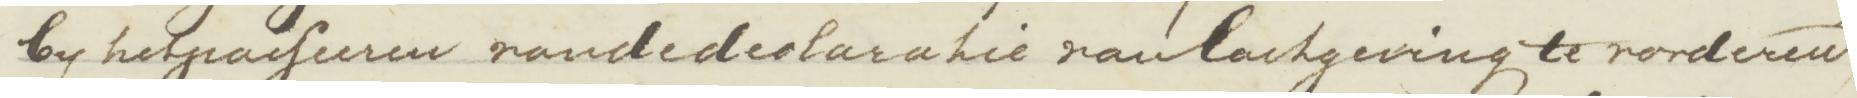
by het passeeren van de declaratie van lastgeving te vorderen
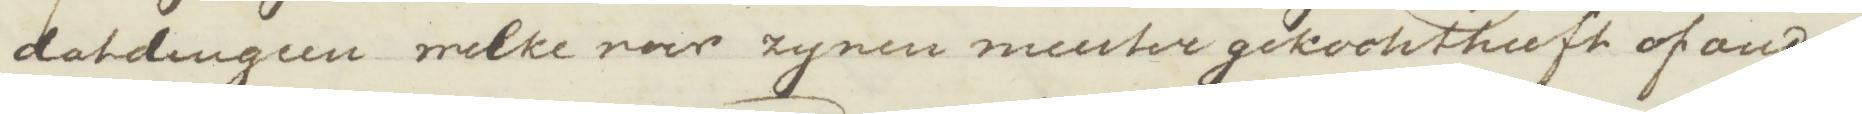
dat dengeen welke voor zynen meester gekocht heeft of andere
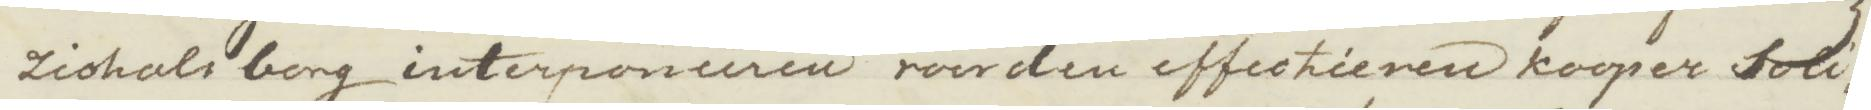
zich als borg interponeeren voor den effectieven kooper soli„
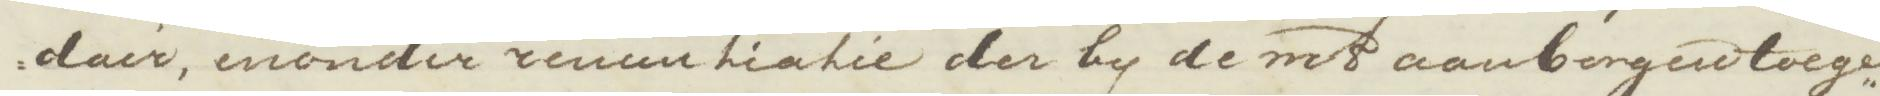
„dair, en onder renunutiatie der by de wet aan borgen toege„
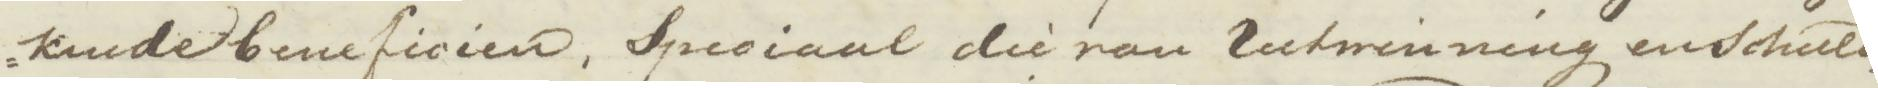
„kende beneficien, Speciaal die van uitwinning en schuld,
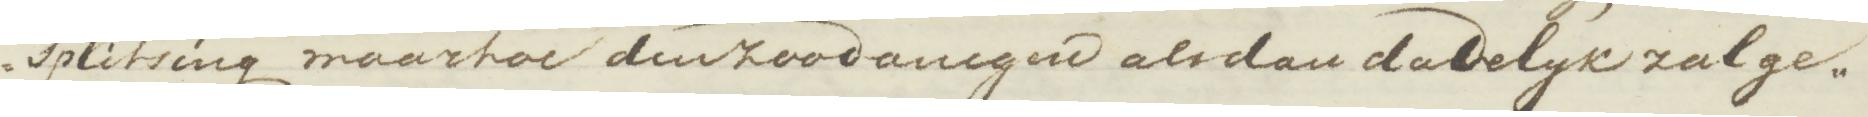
„splitsing waar toe den zoodanigen als dan dadelyk zal ge„
